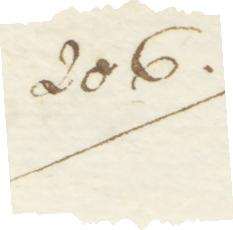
206.
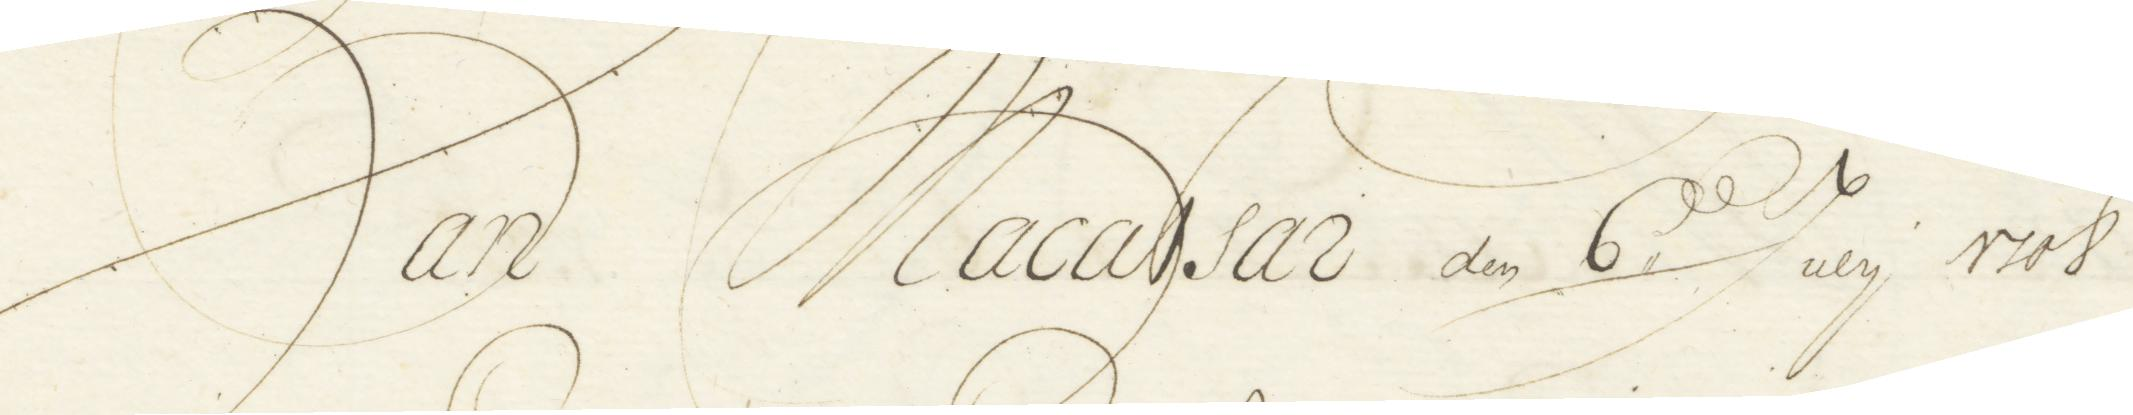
Van Macassar den 6„' July 1708
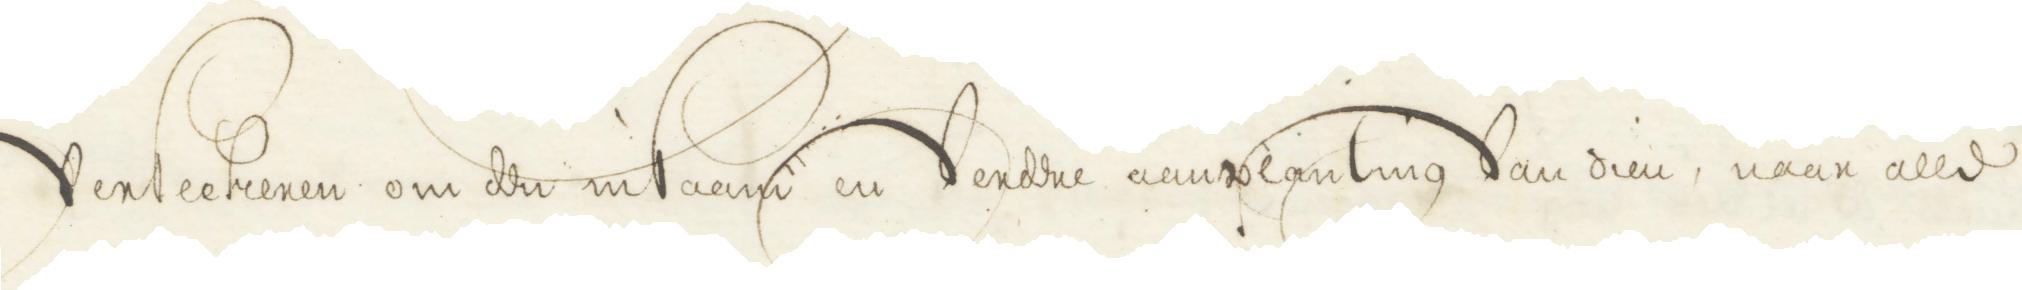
verseekeren om den insaam en verdere aanplanting van dien, naar alle
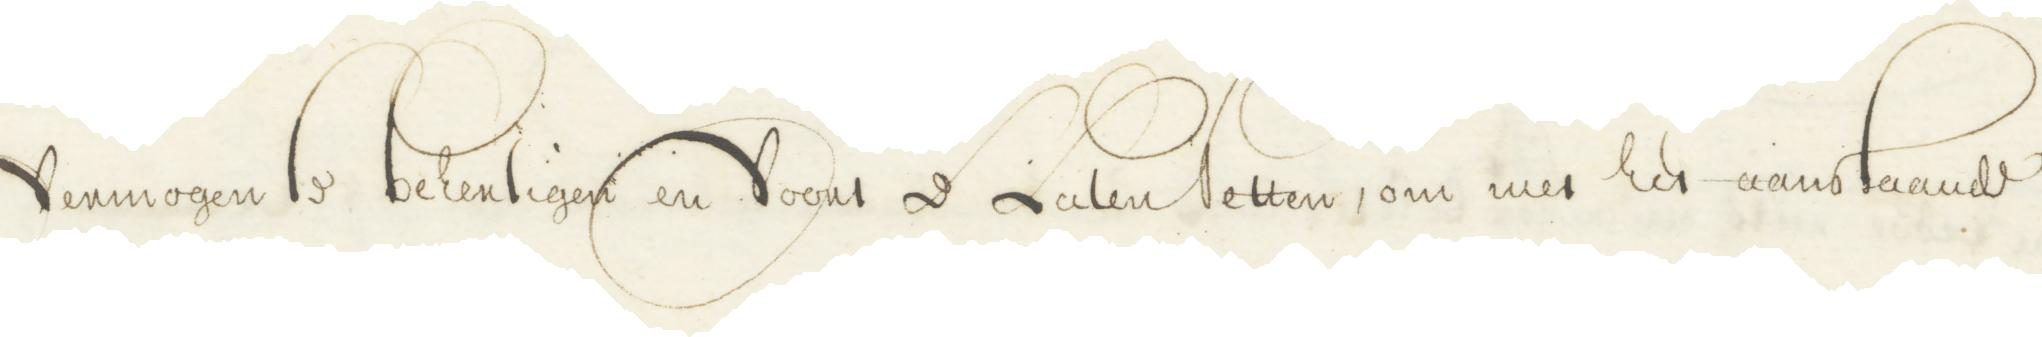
vermogen te behertigen en voort te laten setten, om met het aanstaande
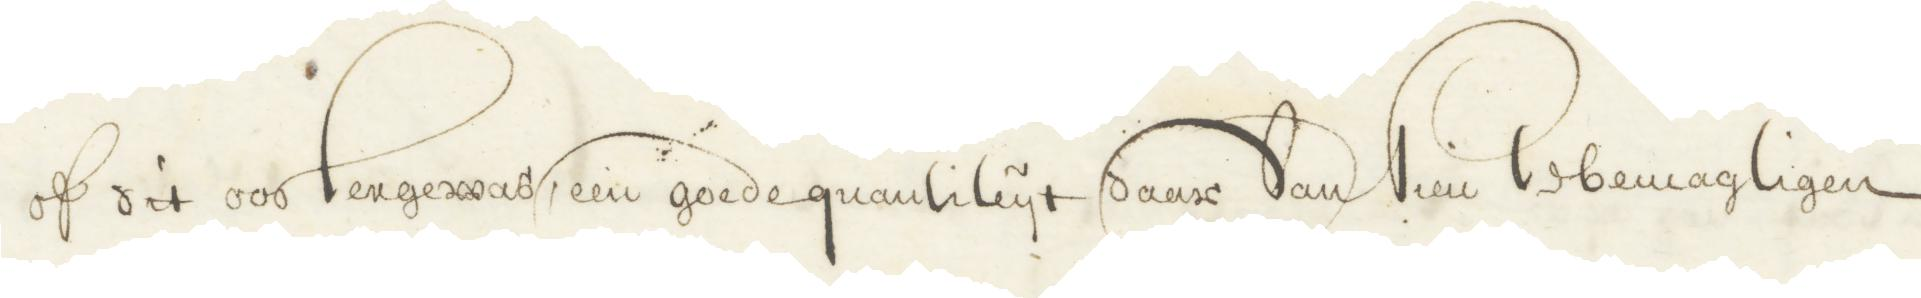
of dit oostergewas, een goede quantiteijt daar van sien te bemagtigen
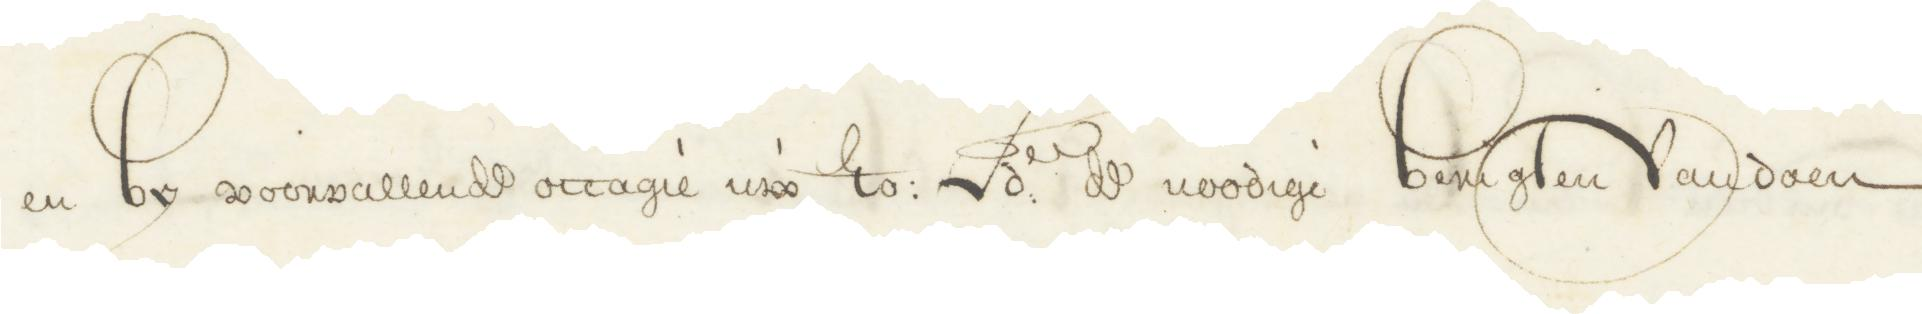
en by voorvallende occagie uw ho: Ed:' de noodige berigten van doen
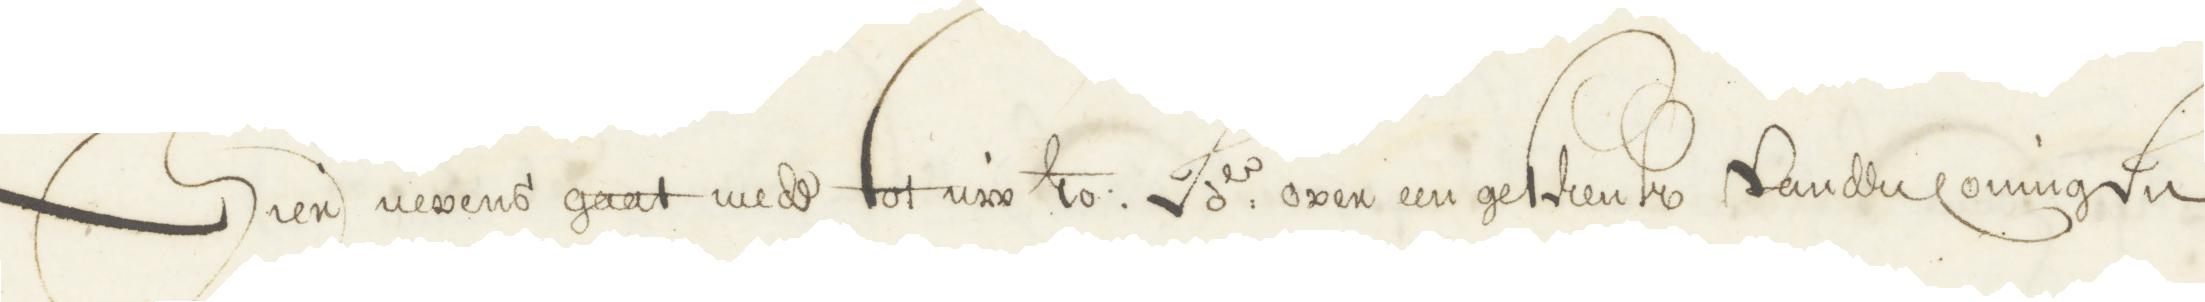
Hier nevens gaat mede tot uw ho: Ed:ls over een geschenk van den coning En
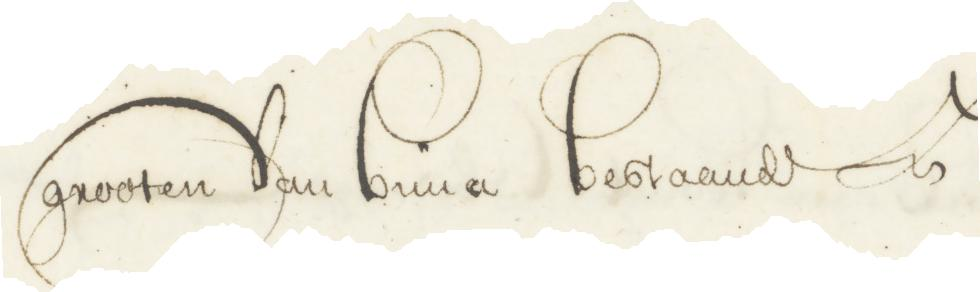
grooten van bima bestaande In
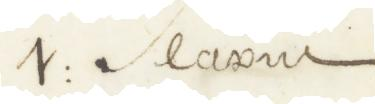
1: slavin
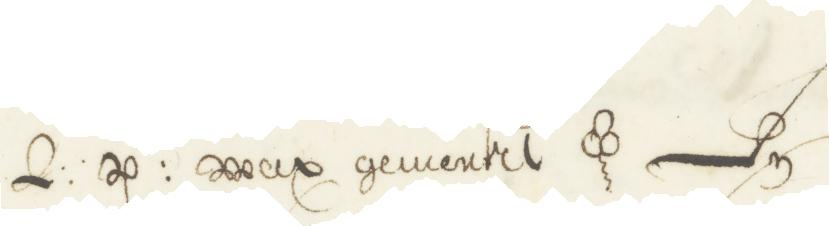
2: p:ls wax gemerkt En
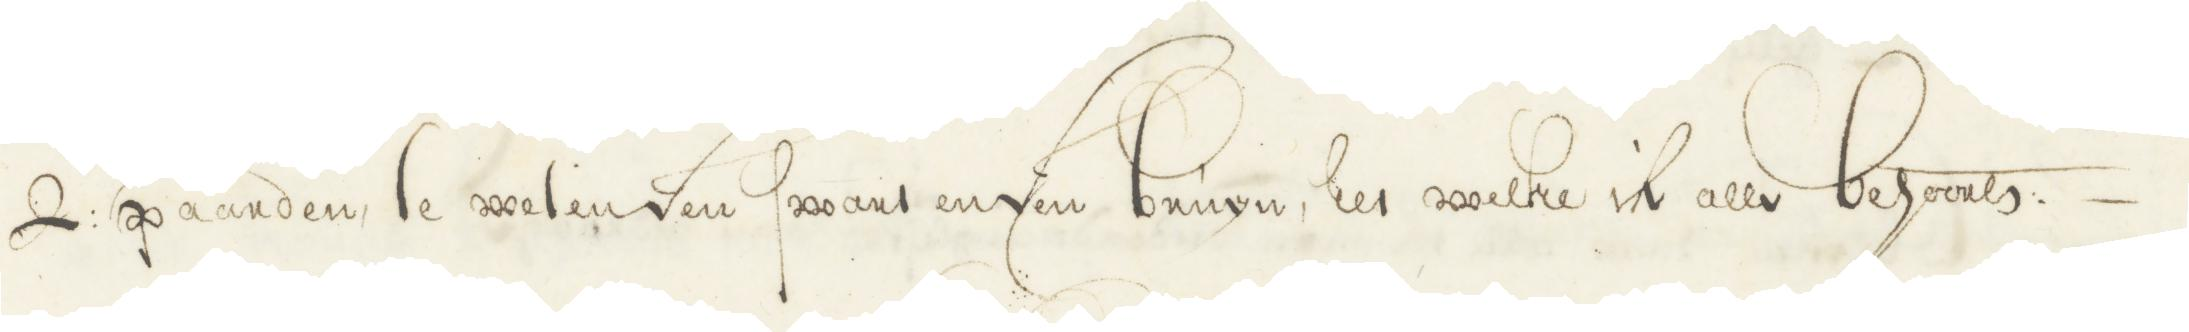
2: paarden, te weten Een swart en Een bruijn, het welke ik alle behoorlijk —
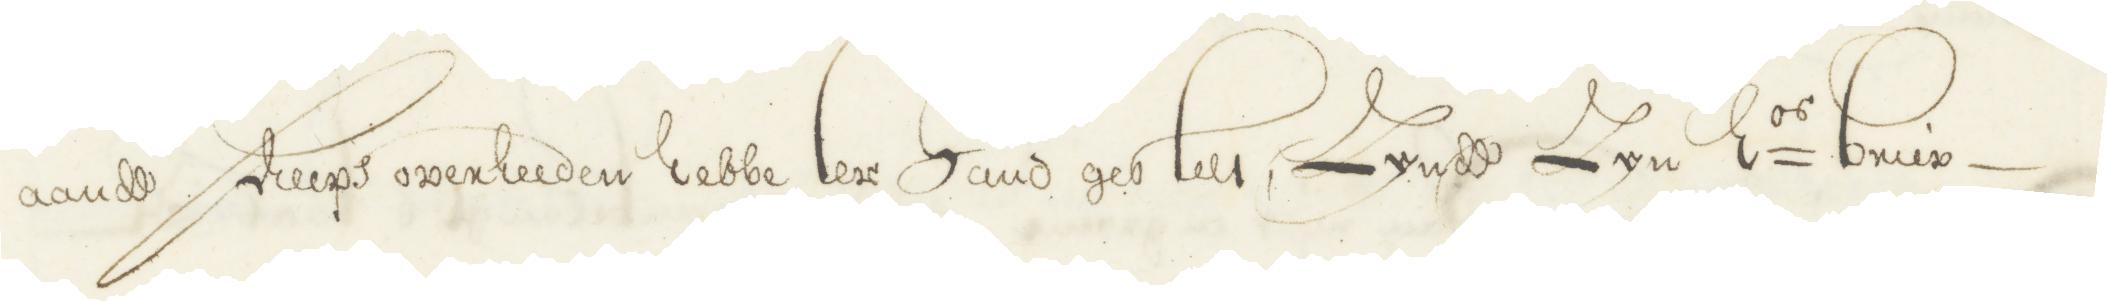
aan de scheeps overheeden hebbe ter Hand gestelt, zijnde zijn h=os briev —
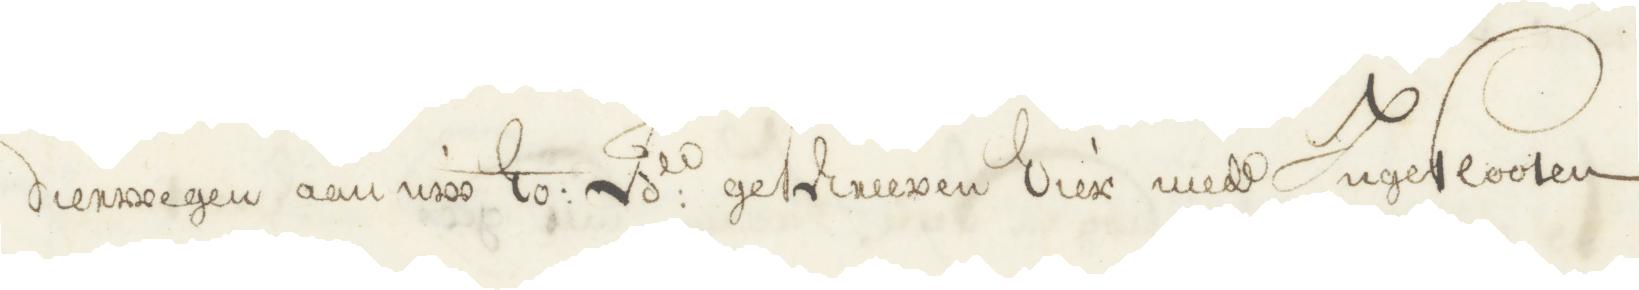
dierwegen aan uw ho: Ed:le geschreeven hier mede Ingeslooten
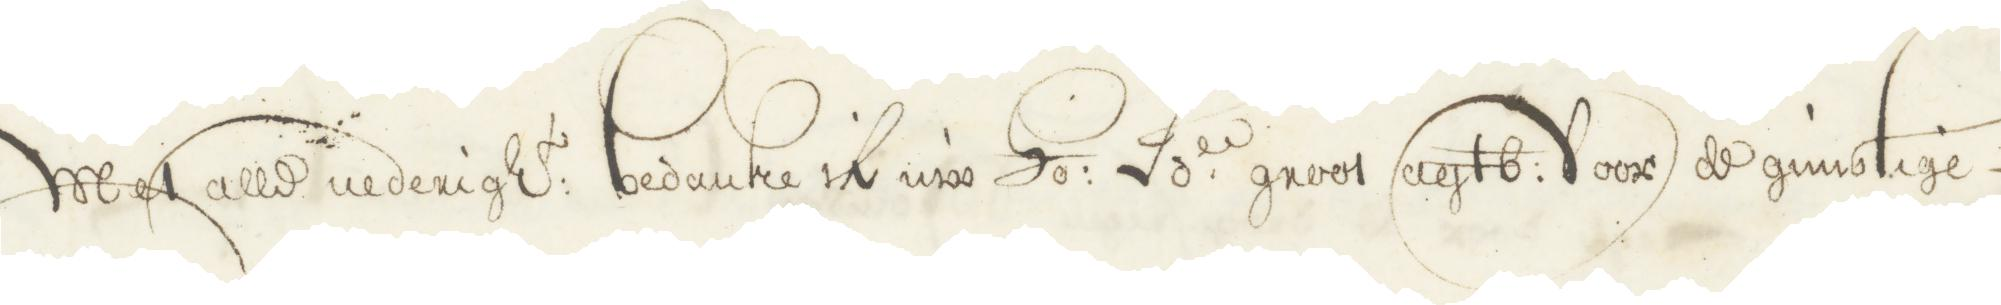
met alle nederigh:t bedanke ik uw ho: Ed:le groot agtb: Voor de gunstige
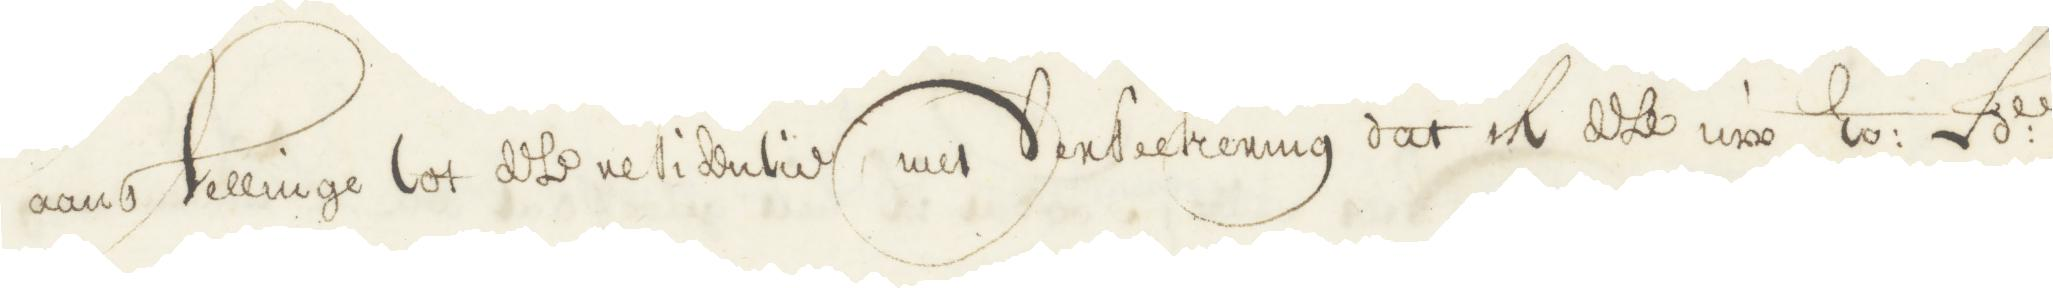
aanstellinge tot dese residentie met verseekering dat ik dese uw ho: Ed:le
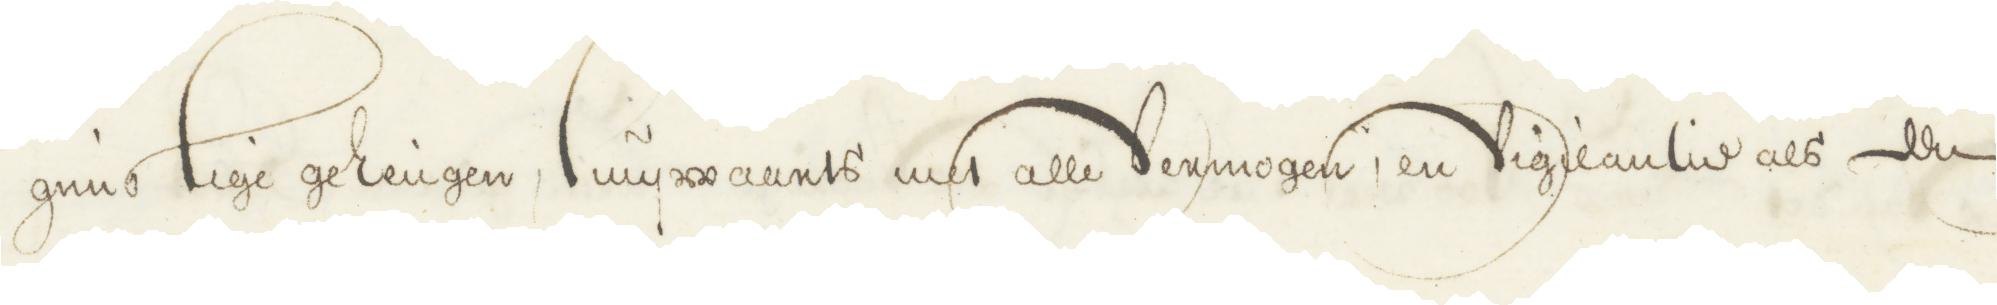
gunstige geheugen, tuijwaarts met alle vermogen, en vigilantie als een
